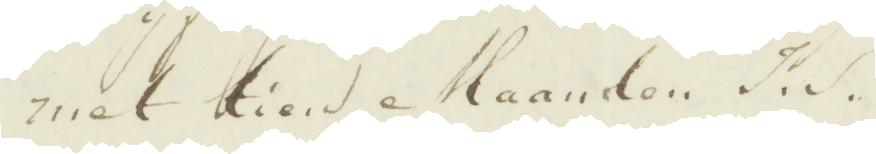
met tien Maanden In.
